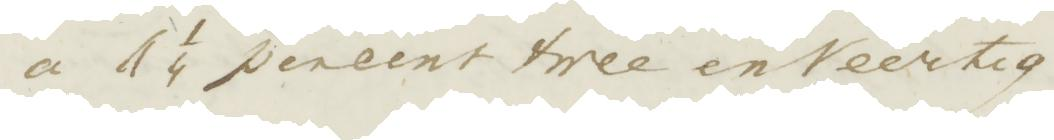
a 4¼ percent twee en Veertig
